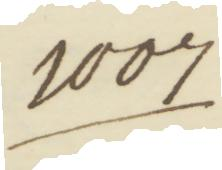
1007
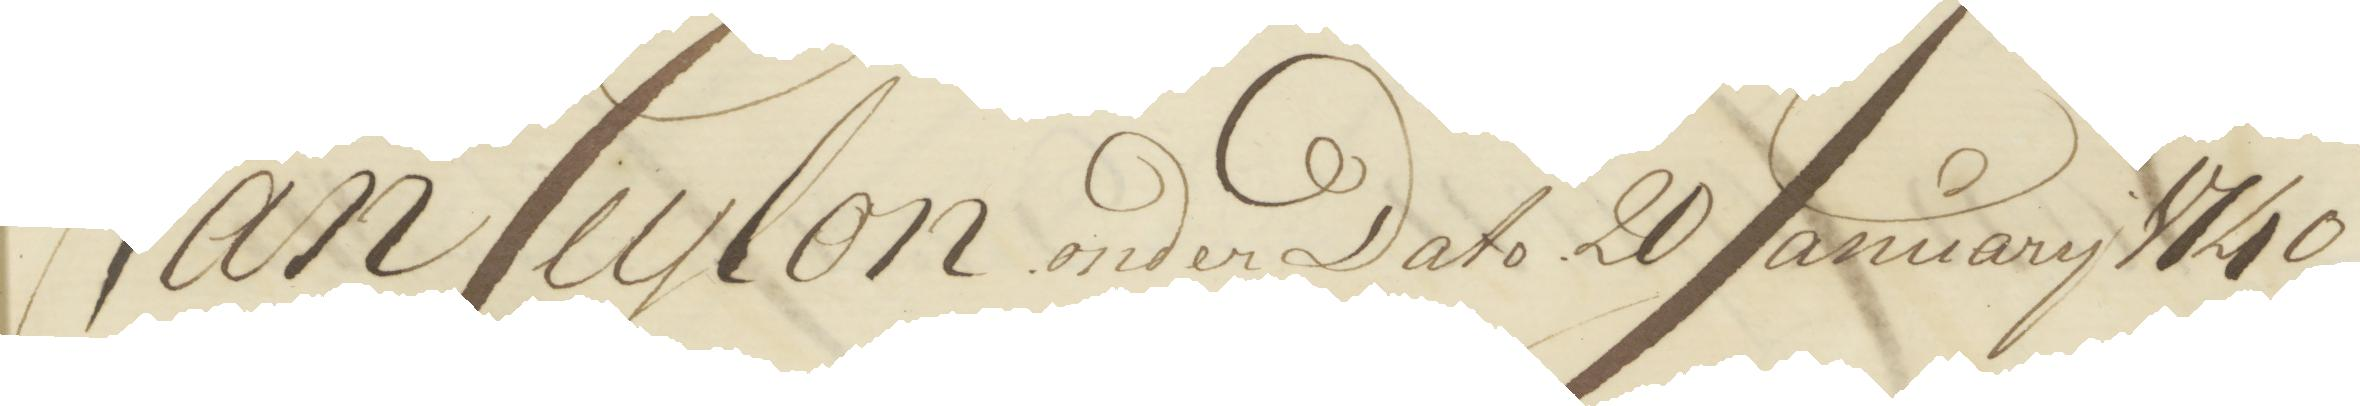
Van Ceylon onder Dato 20 Januarij 1740
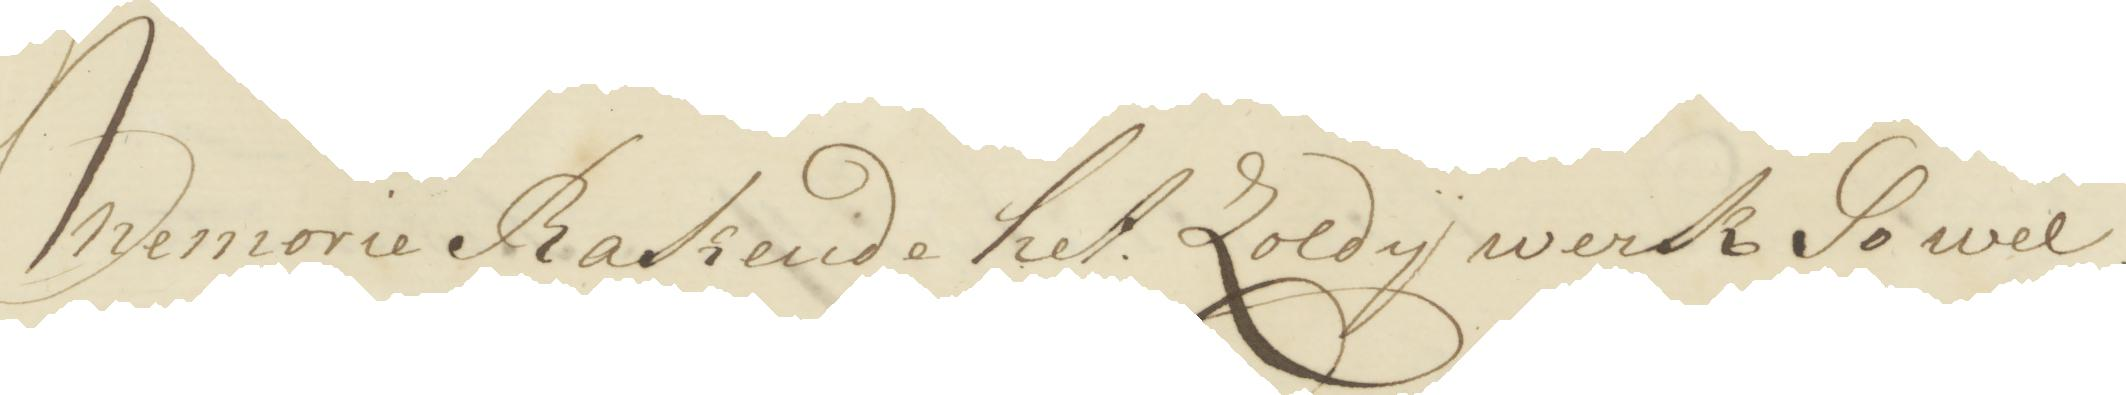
Memorie Rakende het zoldij werk so wel
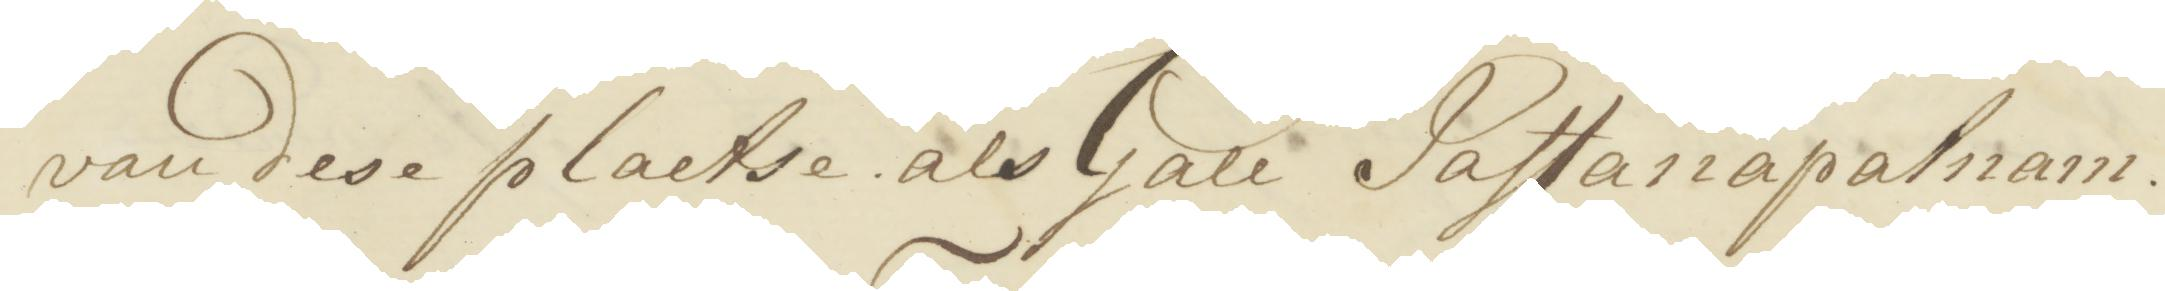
van dese plaetse. als Gale Jaffanapatnam.
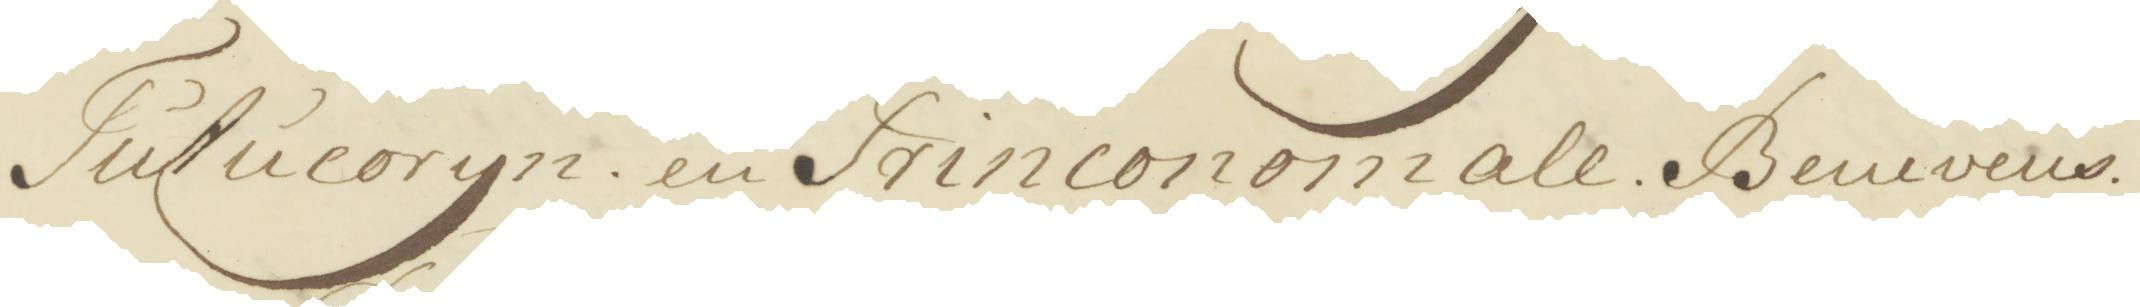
Tutucoryn. en Trinconomale Benevens.
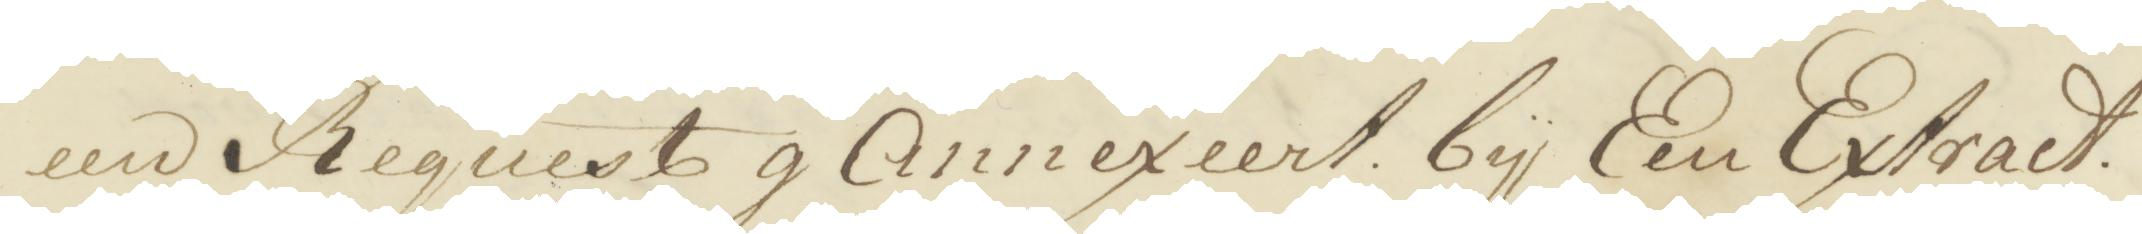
een Request g’Annexeert. bij Een Extract.
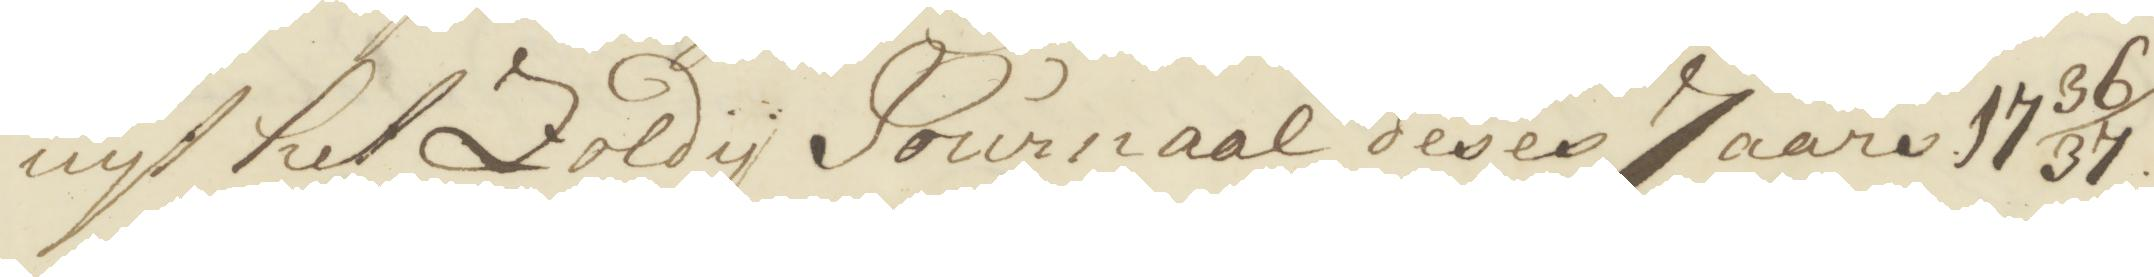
uijt het zoldij Journaal deser Jaars 17 36/37
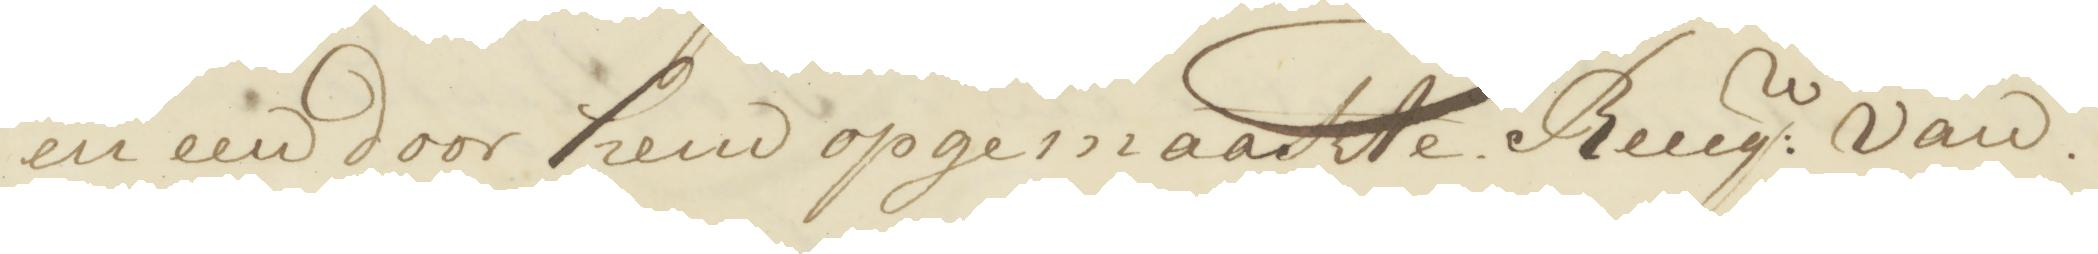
en een door hem opgemaakte Reecq:e van.
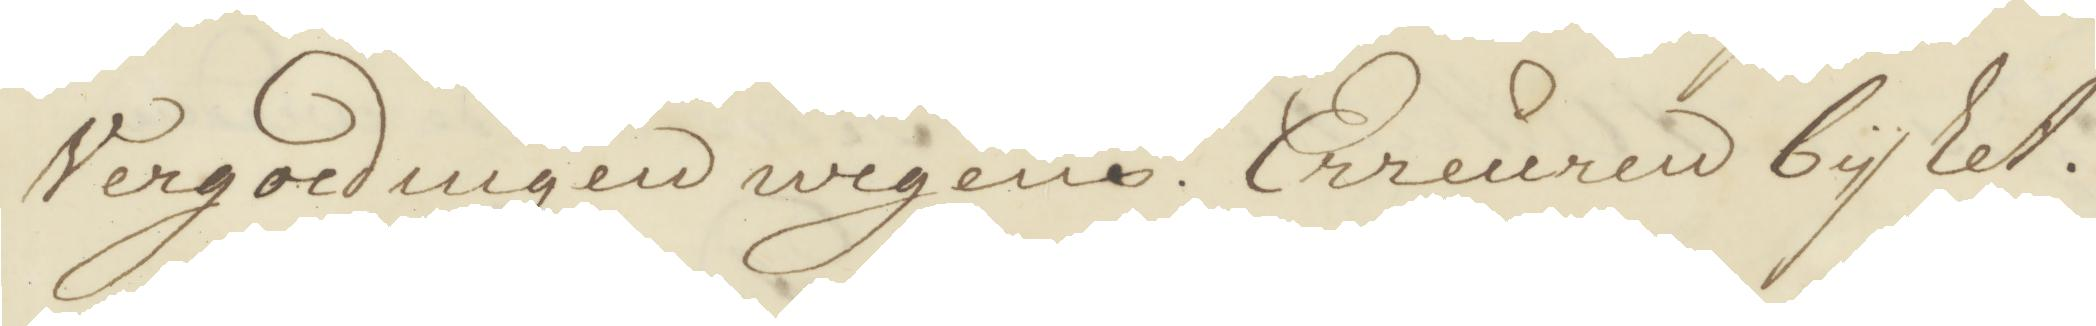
Vergoedingen wegens. Erreuren bij het.
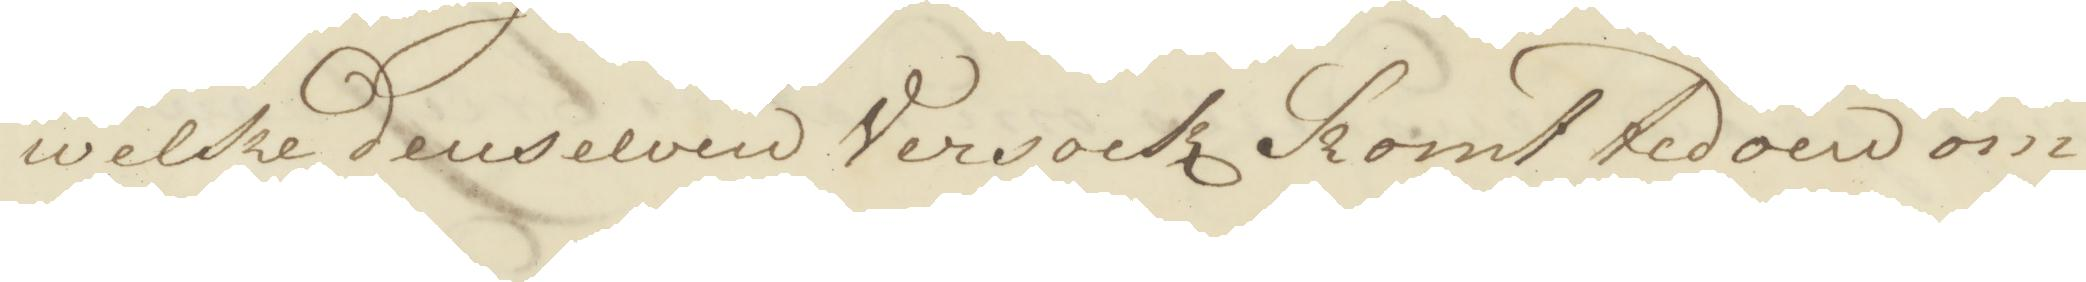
welke denselven Versoek komt tedoen om
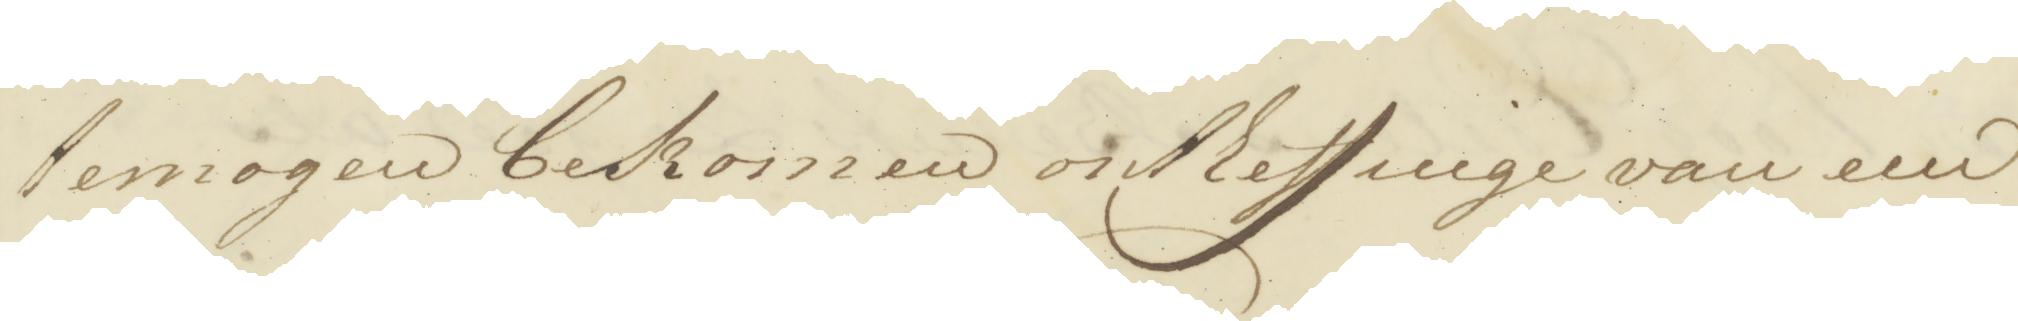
temogen bekomen ontheffinge van een
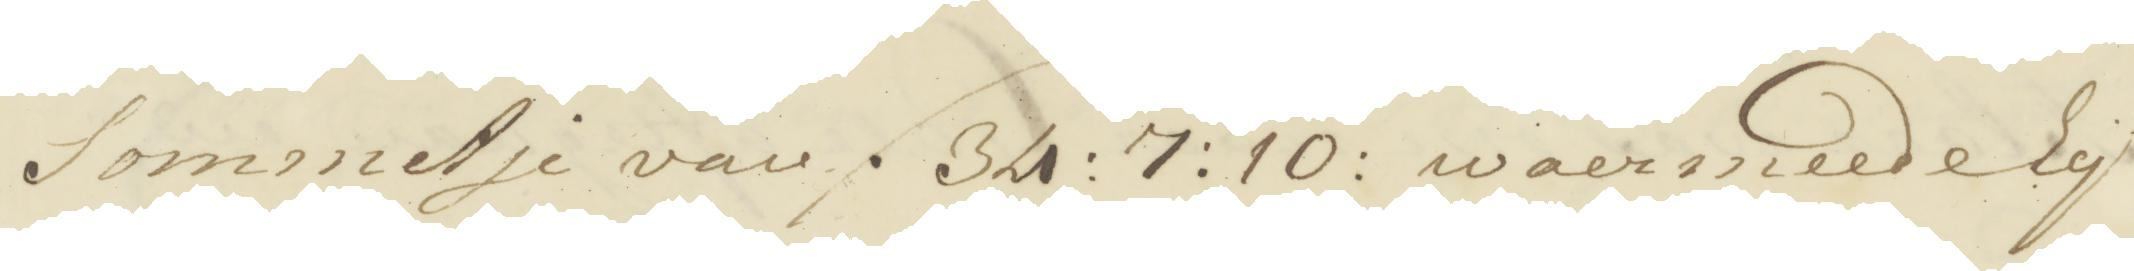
sommetje van ƒ34:7:10: waermeede hij
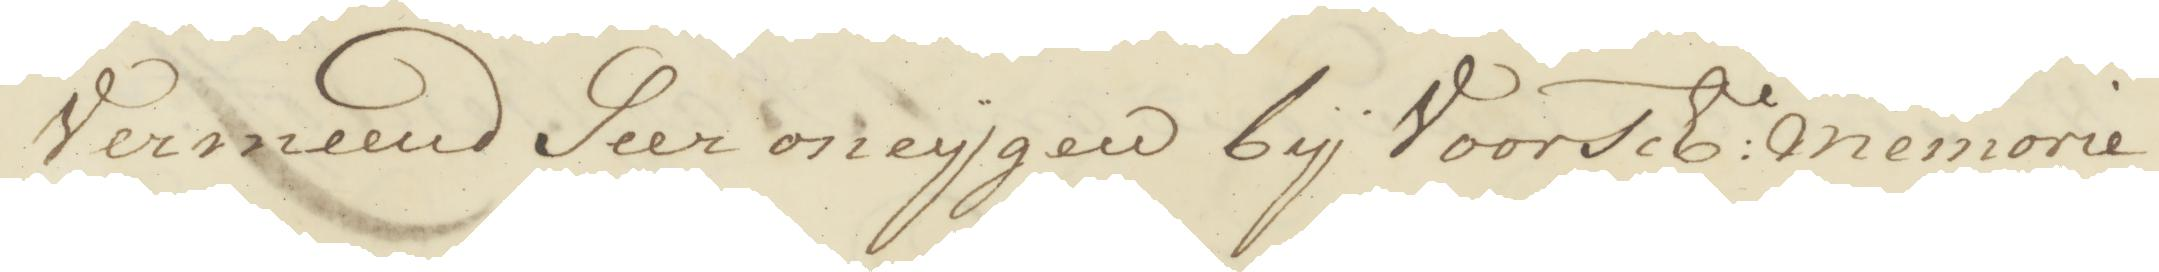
Vermeend seer oneijgen bij Voorsch:e memorie
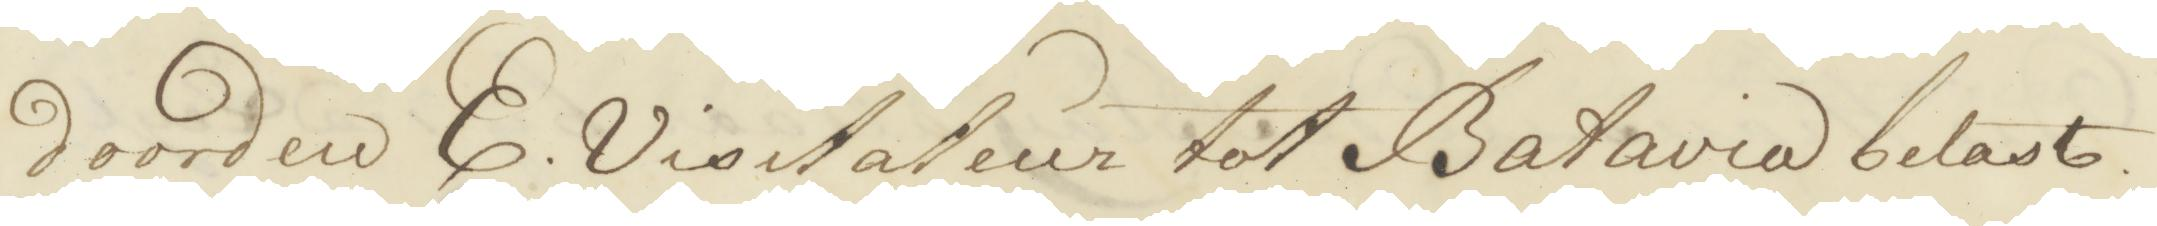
doorden E. Visitateur tot Batavia belast.
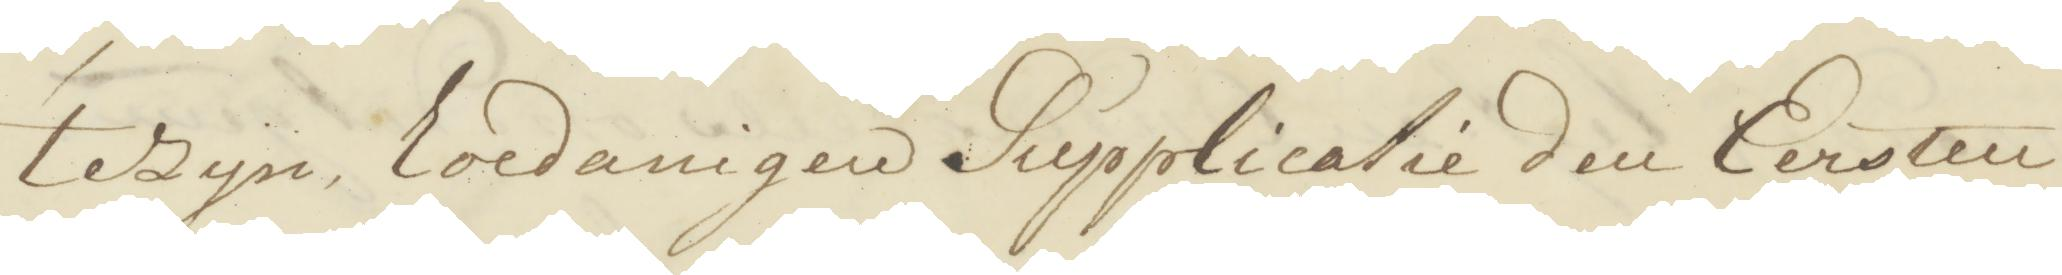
te zijn, hoedanigen supplicatie den Eersten
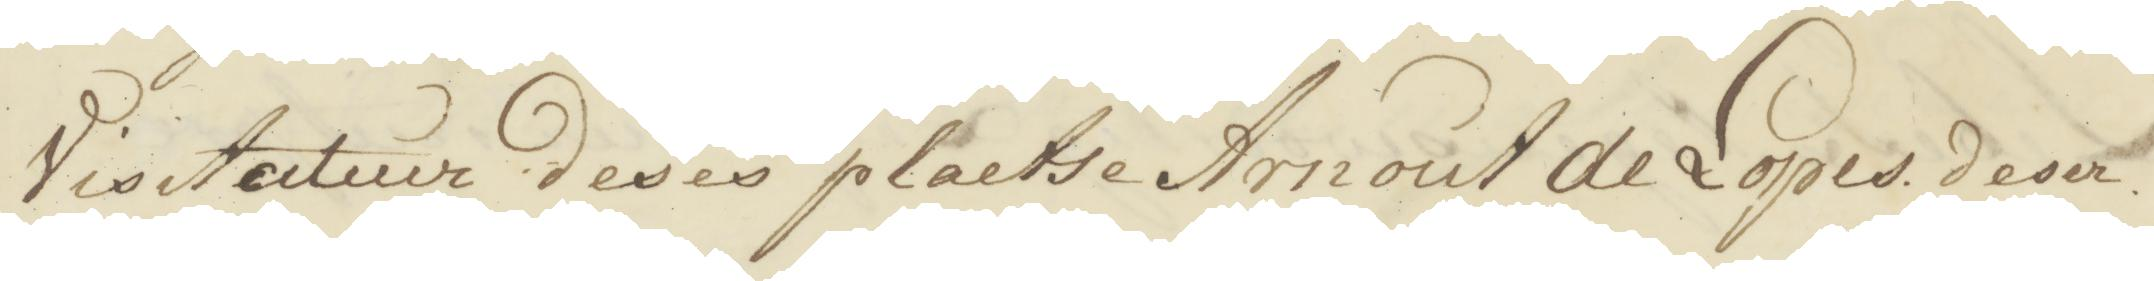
Visitateur deses plaetse Arnout de Lopes deser.
